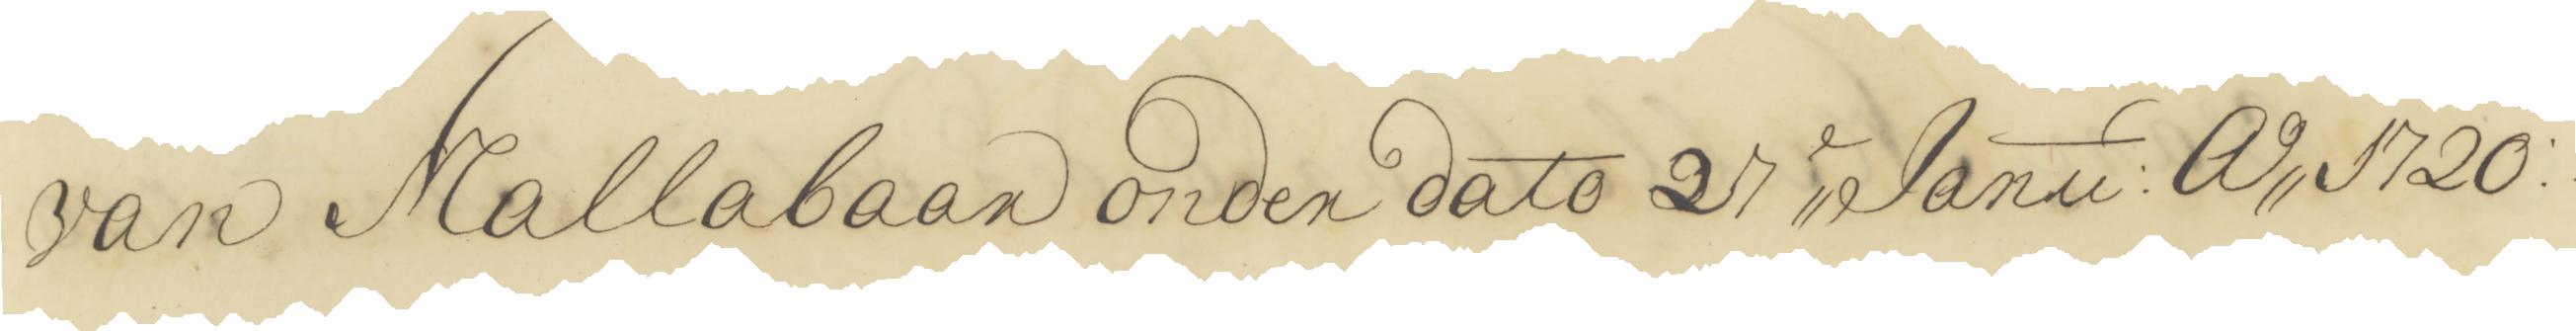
van Mallabaar onder dato 27„e Ianu: A„o 1720:
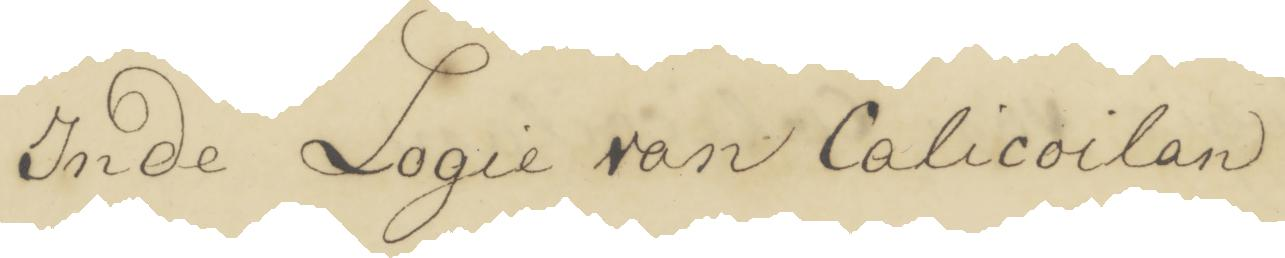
In de Logie van Calicoilan
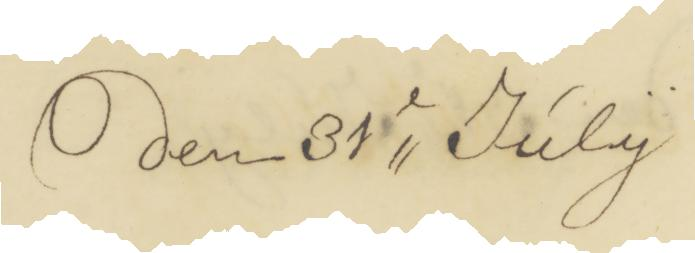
den 31„e Iulij
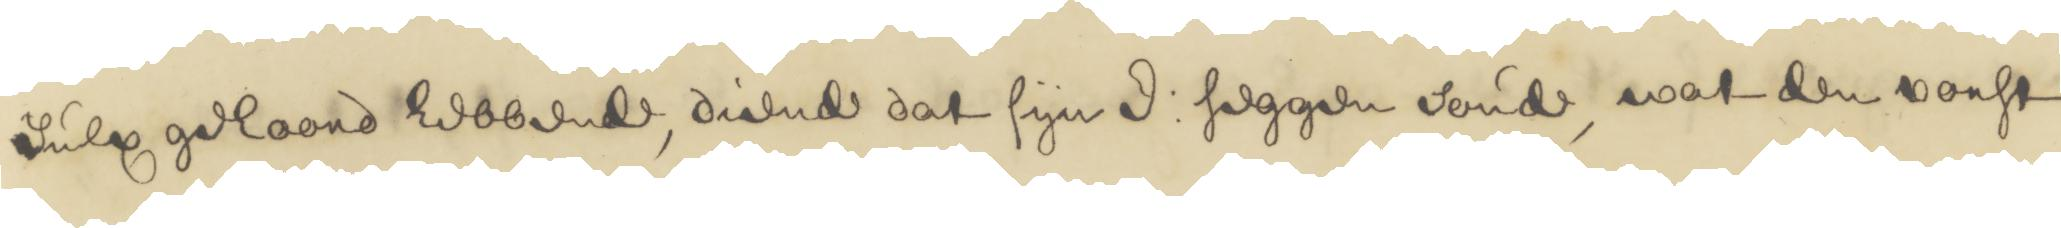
sulx gehoord hebbende, diende dat sijn E: seggen soude, wat den vorst
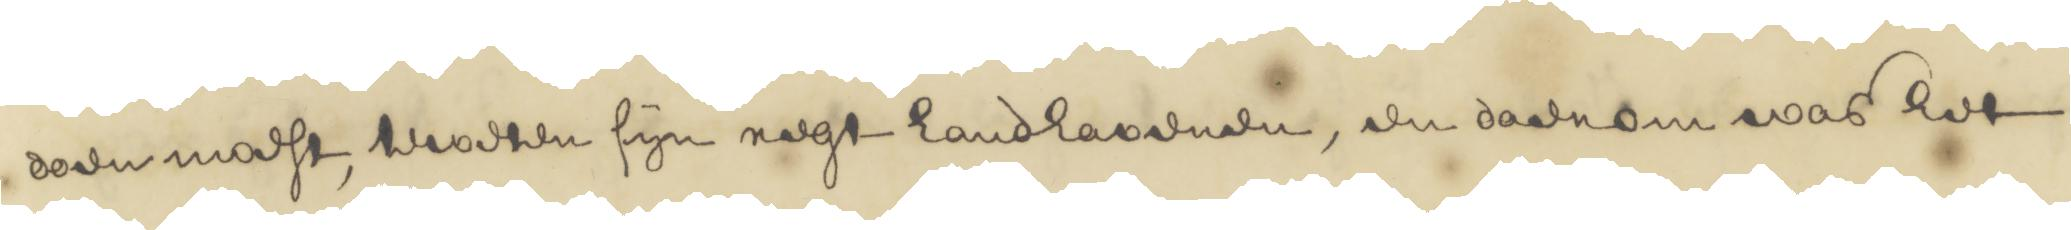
doen moest, teweten sijn regt handhavenen, en daerom was het
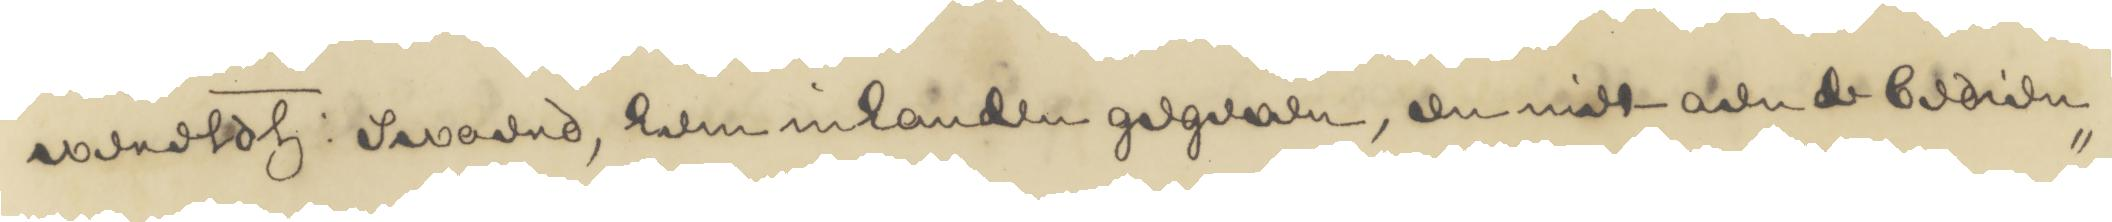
wereldlijk swaerd, hem inhanden gegeven, en niet aen de bedien„
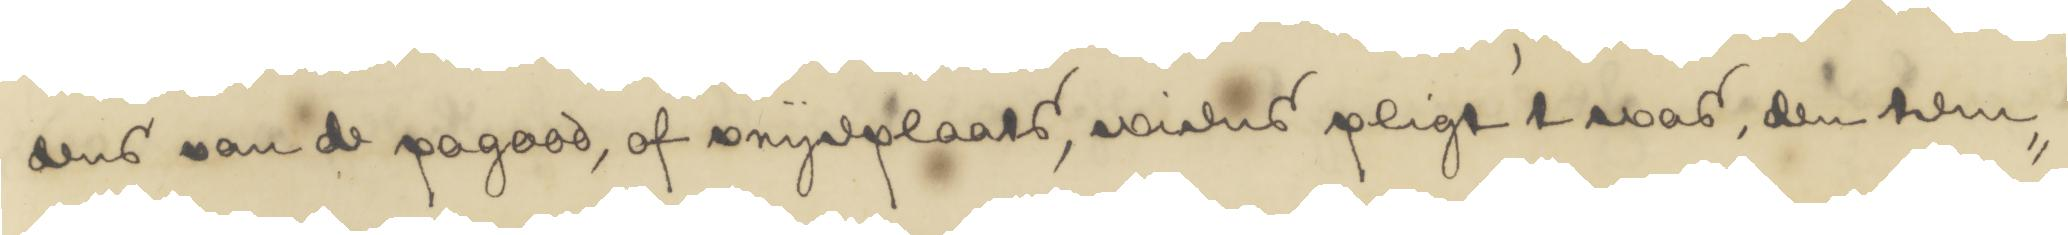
dens van de pagood, of vrijeplaats, wiens pligt ’t was, den tem„
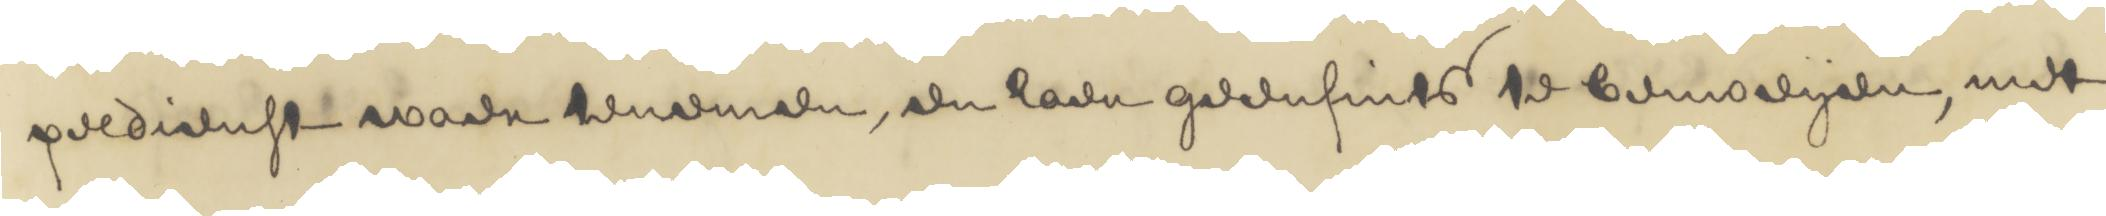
peldienst waer tenemen, en haer geensints te bemoeijen, met
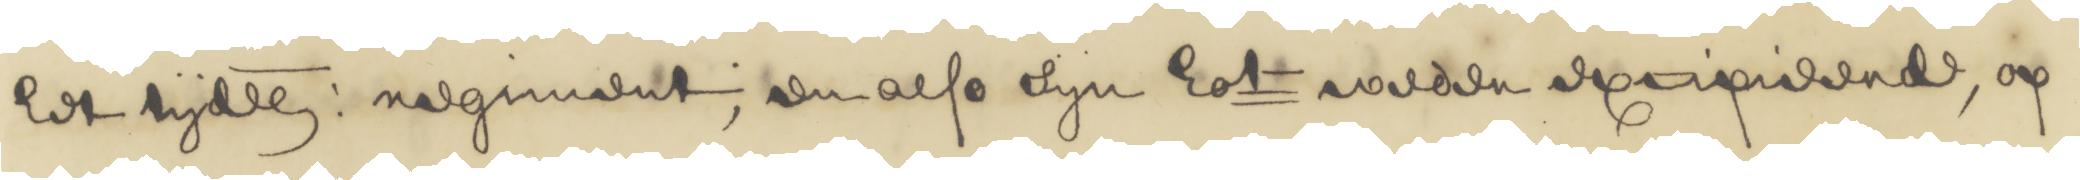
het tijdelijk regiment; en also sijn ho=t weder excipieerde, op
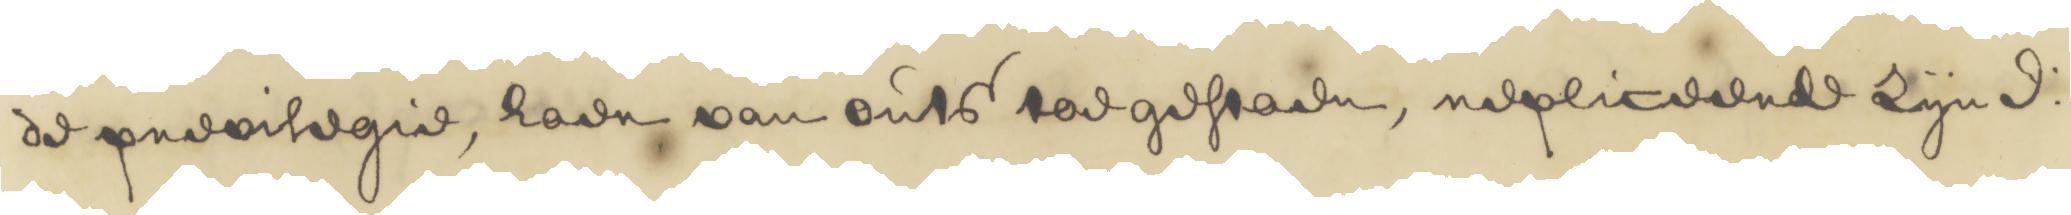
de previlegie, haer van outs toegestaen, repliceerde zijn E
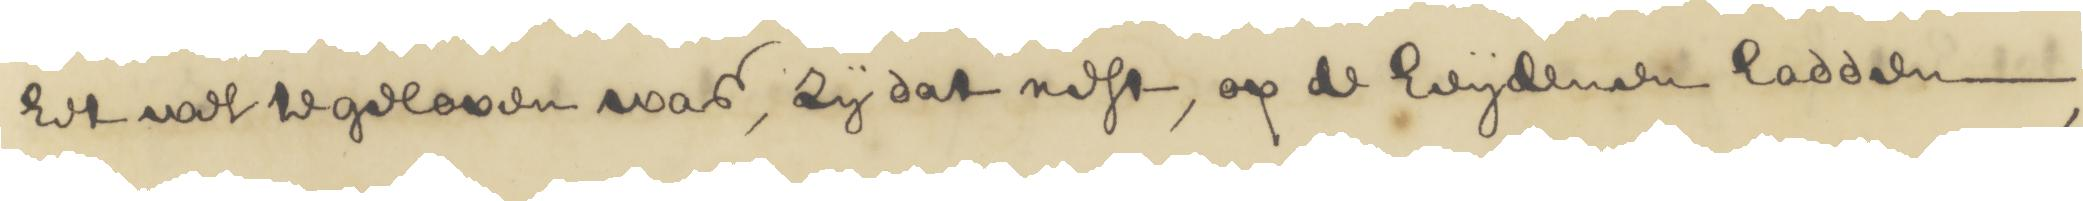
het wel te geloven was, zij dat rest, op de heijdenen hadden,
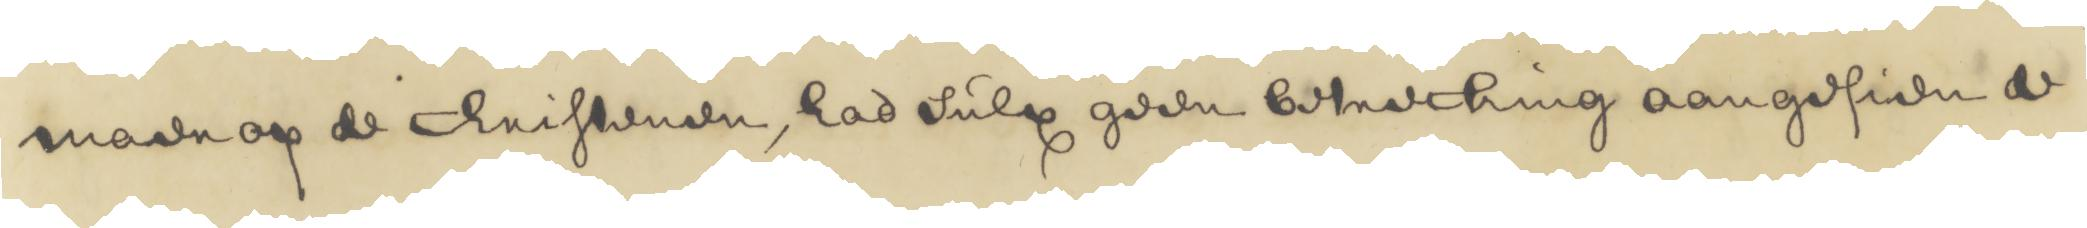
maer op de christenen, had sulx geen betrecking aangesien de
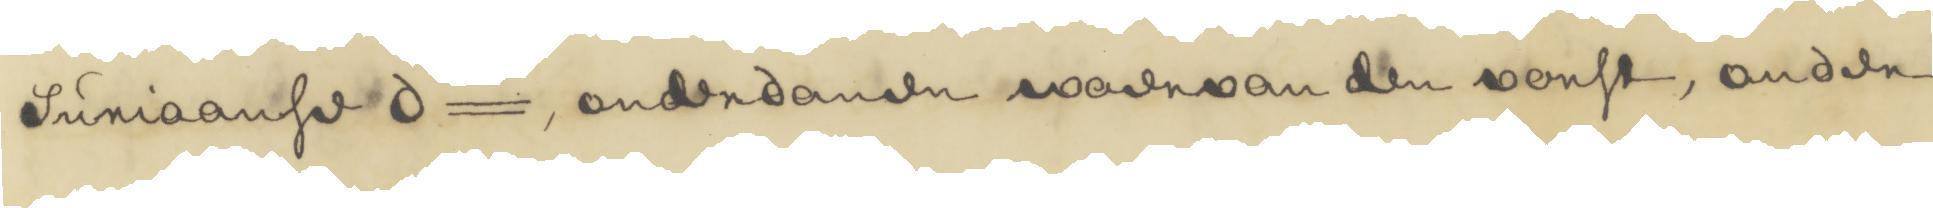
suriaanse d=os, onderdanen waervan den vorst, onder
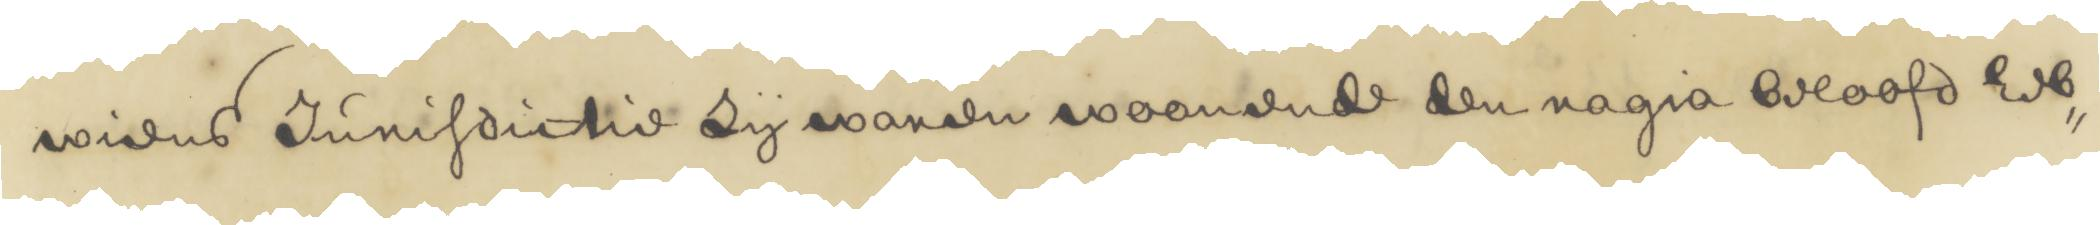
wiens Iurisdictie zij waren woonende den ragia beloofd heb„
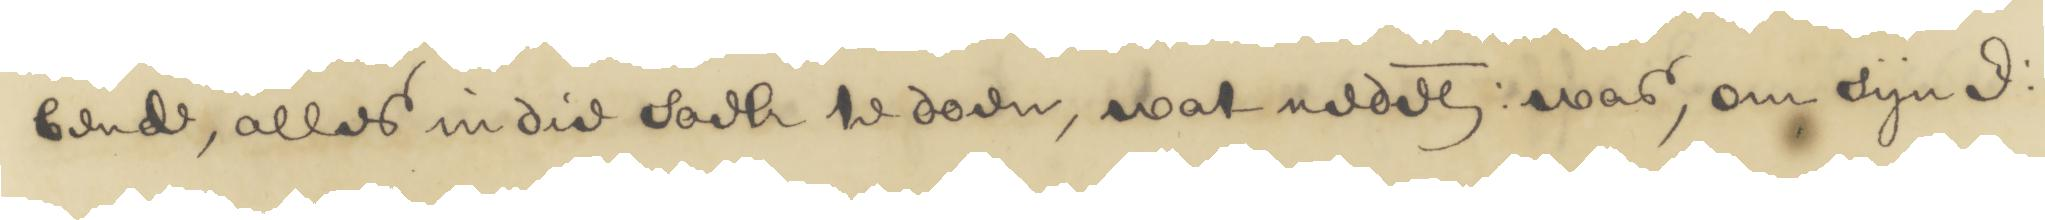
bende, alles in die soek te doen, wat redelijk was, om sijn E
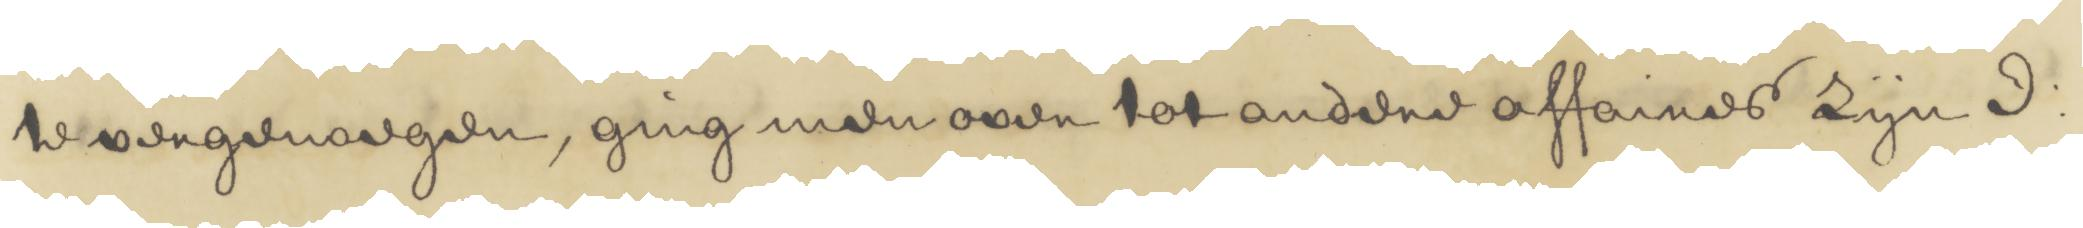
te vergenoegen, ging men over tot andere affaires zijn E:
